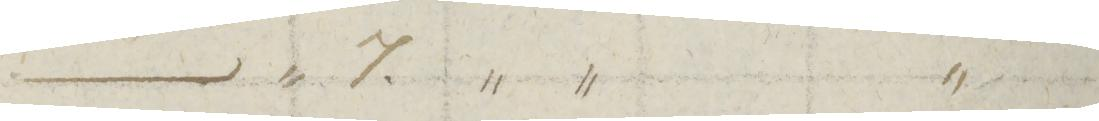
— „ 7. „ „ „
